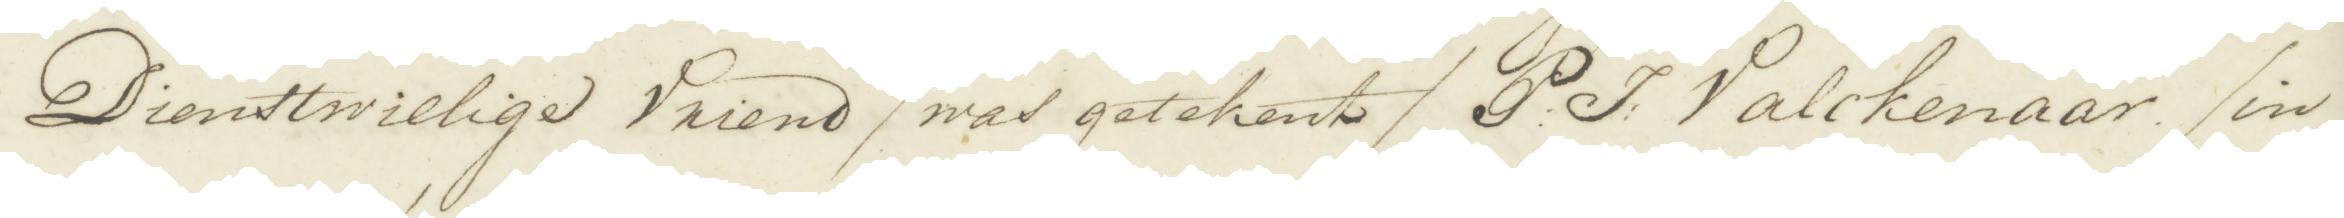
Dienstwillige Vriend / was getekent / P: J: Valckenaar. / in
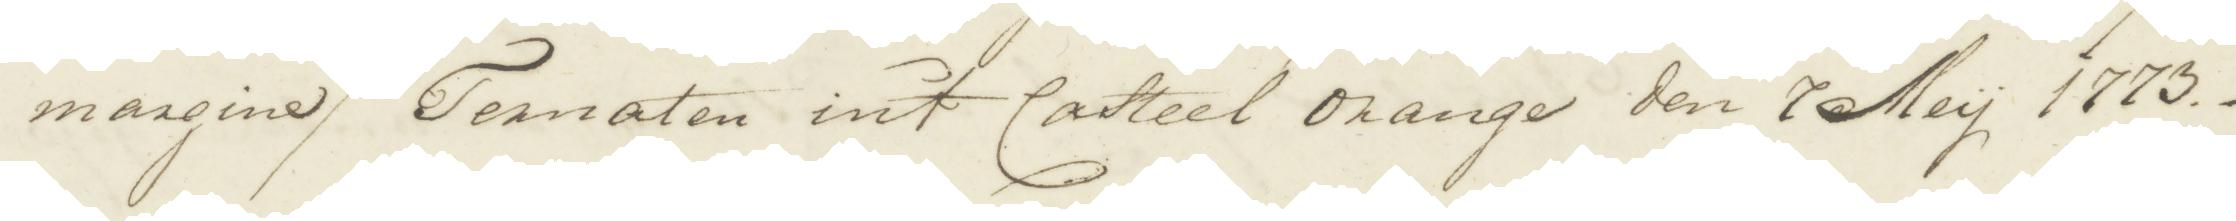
margine/ Ternaten in’t Casteel orange den 7 Meij 1773.
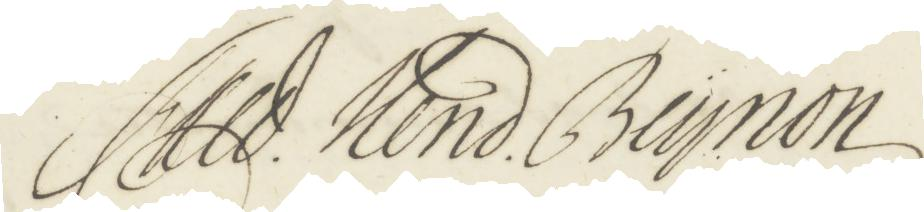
Fred. Hend. Beijnon
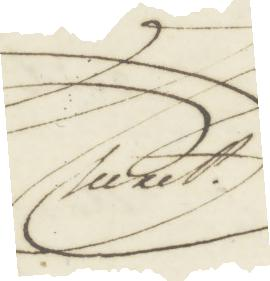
secret.
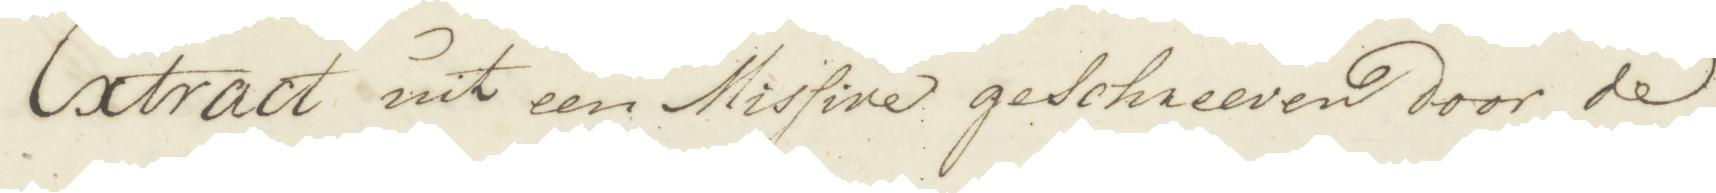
Extract uit een Missive geschreeven door de
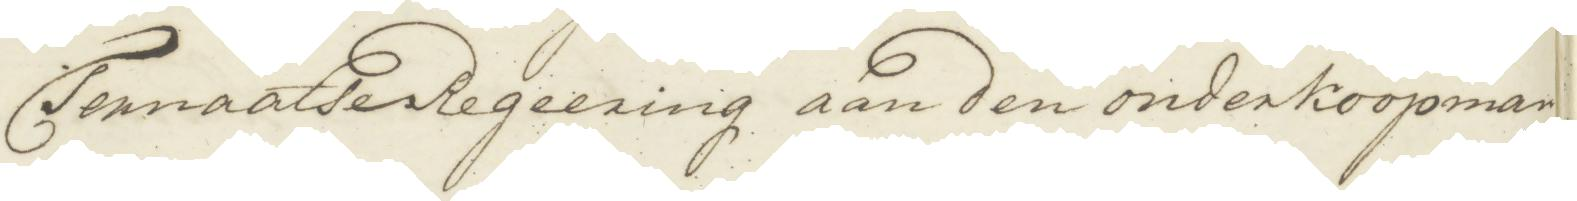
Ternaatse Regeering aan den onderkoopman
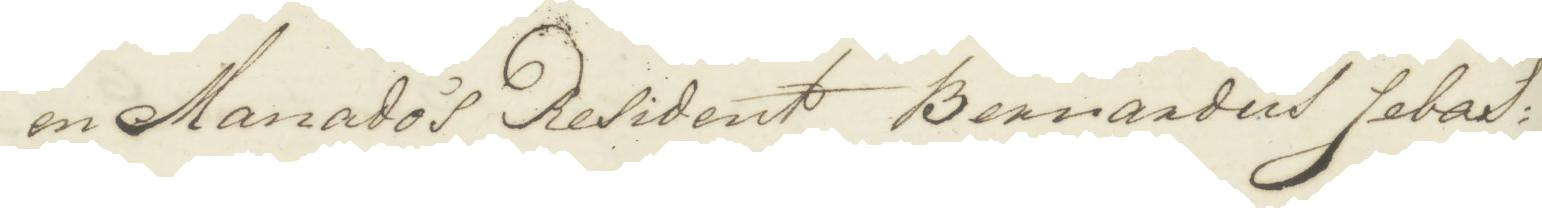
en Manado's Resident Bernardus Sebas„
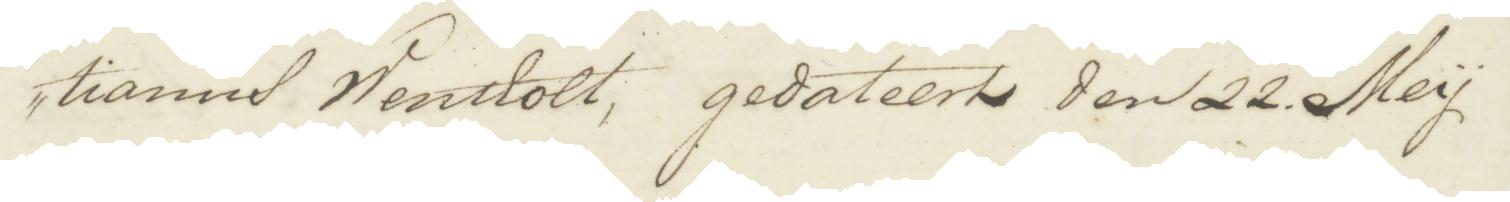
„tianus Wentholt, gedateert den 22. Meij
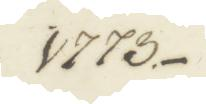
1773.-
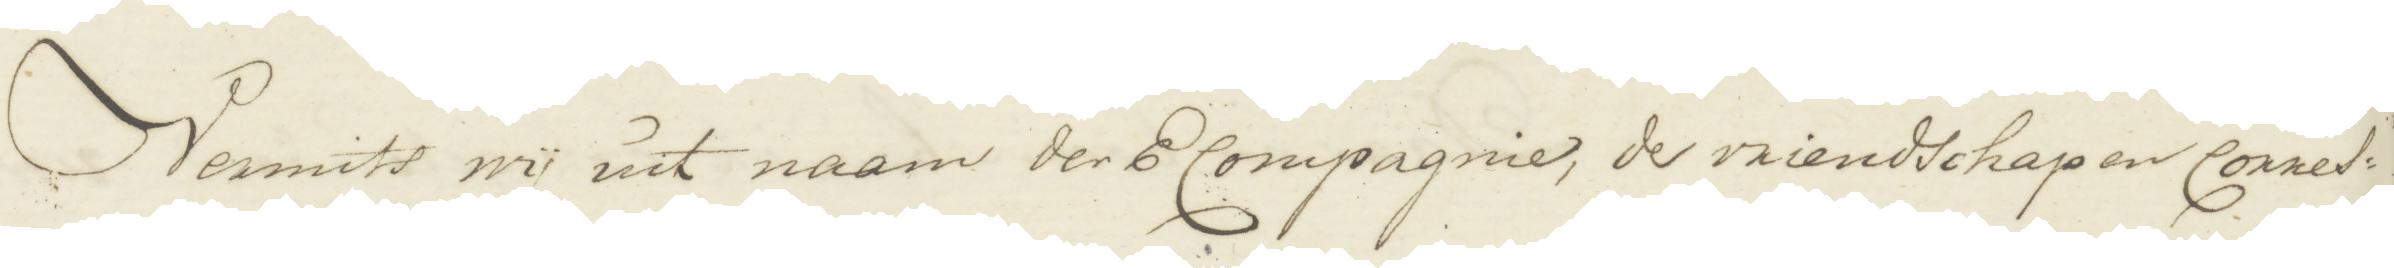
Vermits wij uit naam der E Compagnie, de vriendschap en Corres„
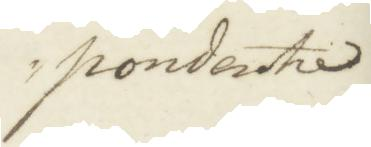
„pondentie
